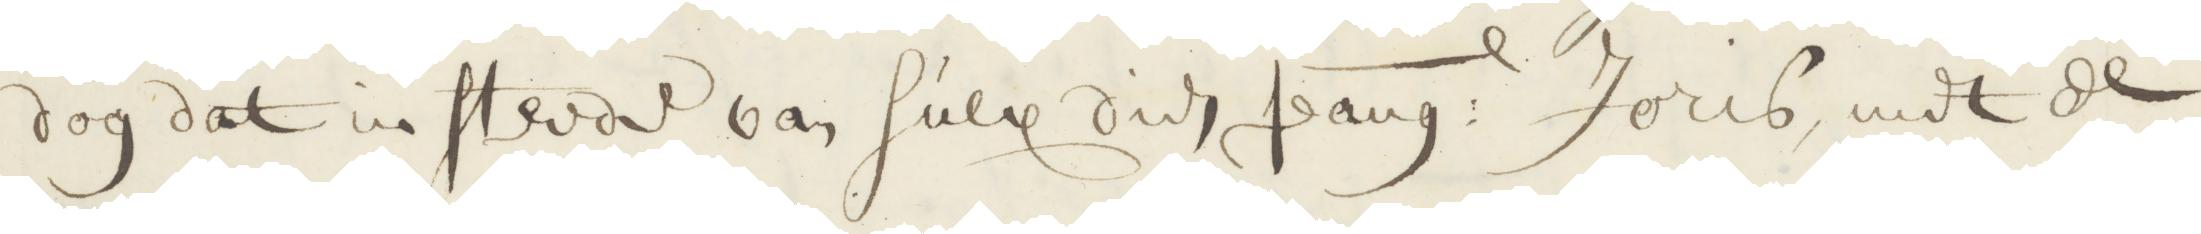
dog dat in steede van sulx dien pang:e Joris, met de
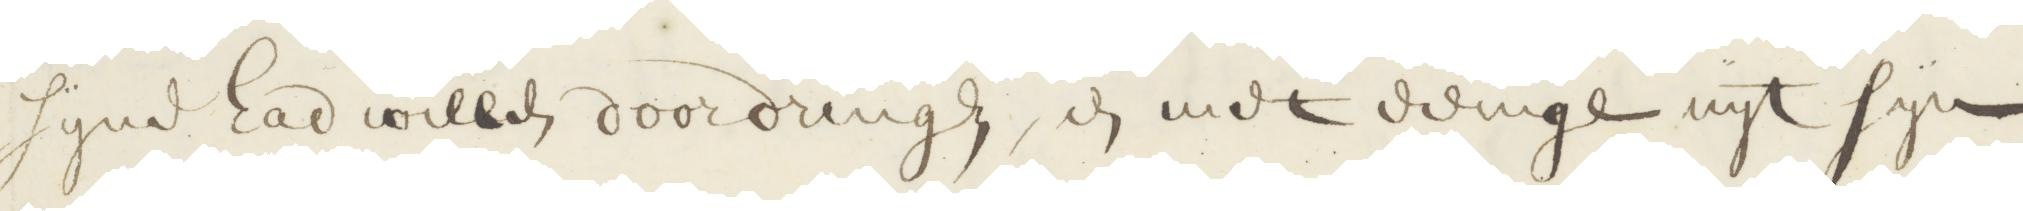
sijne had willen doordringen, en met eenige uijt sijn
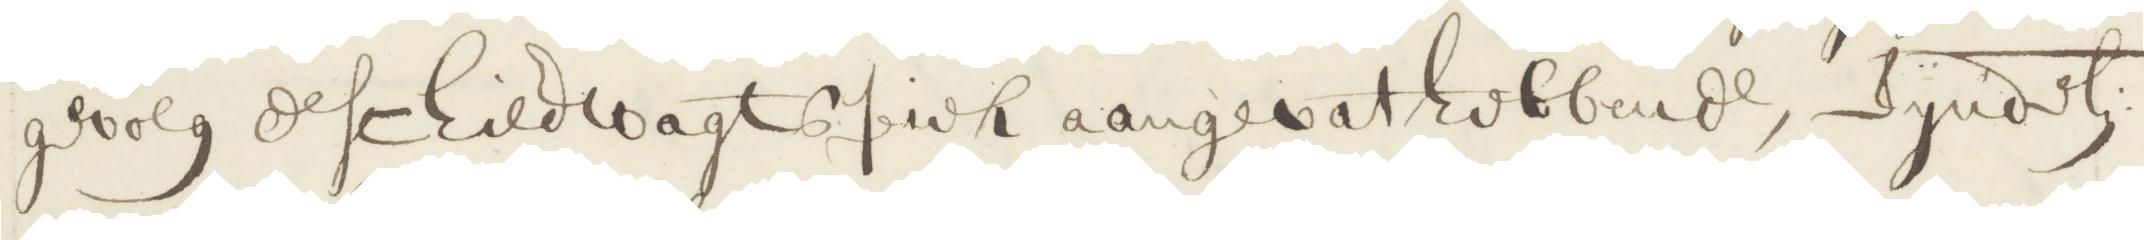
gevolg de schildwagtspiek aangevat hebbende, Eijndelijk
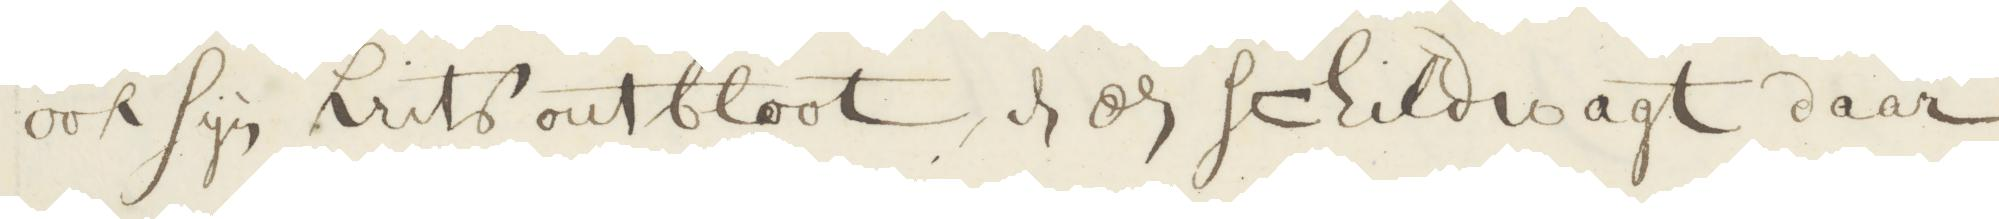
ook sijn krits ontbloot, en den schildwagt daar
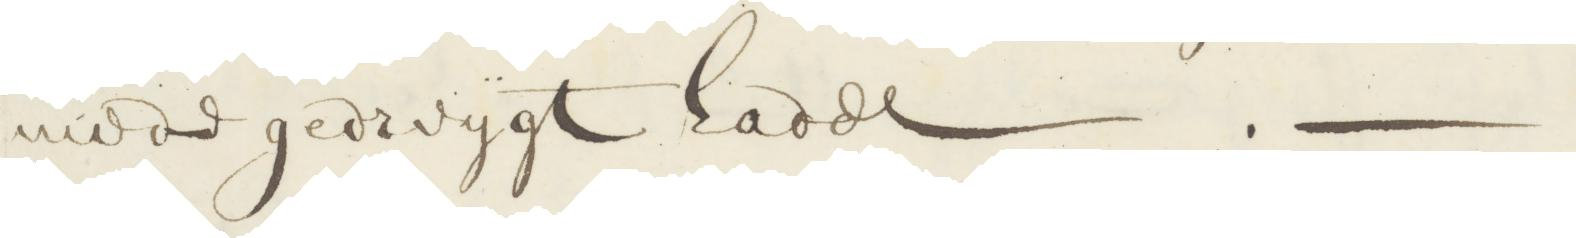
mede gedreijgt hadde. —
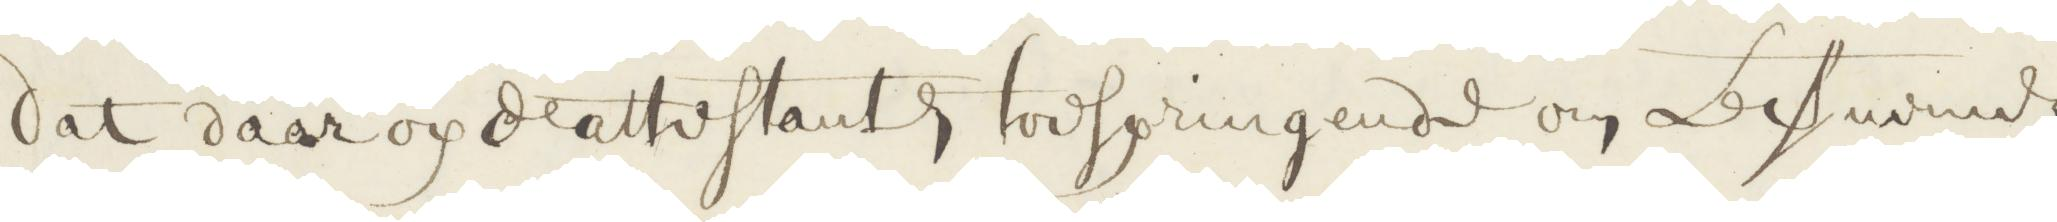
dat daar op de attestanten toespringende om te vernemen
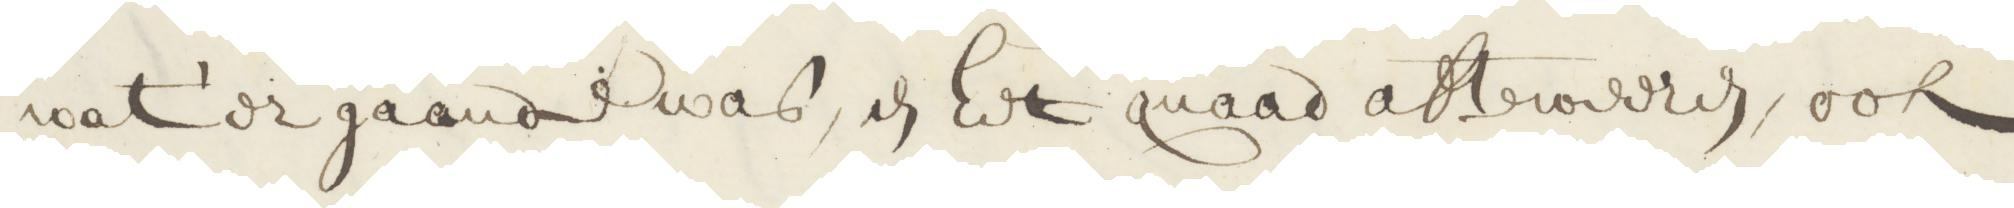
wat’er gaande was, en het quaad afteweeren, ook
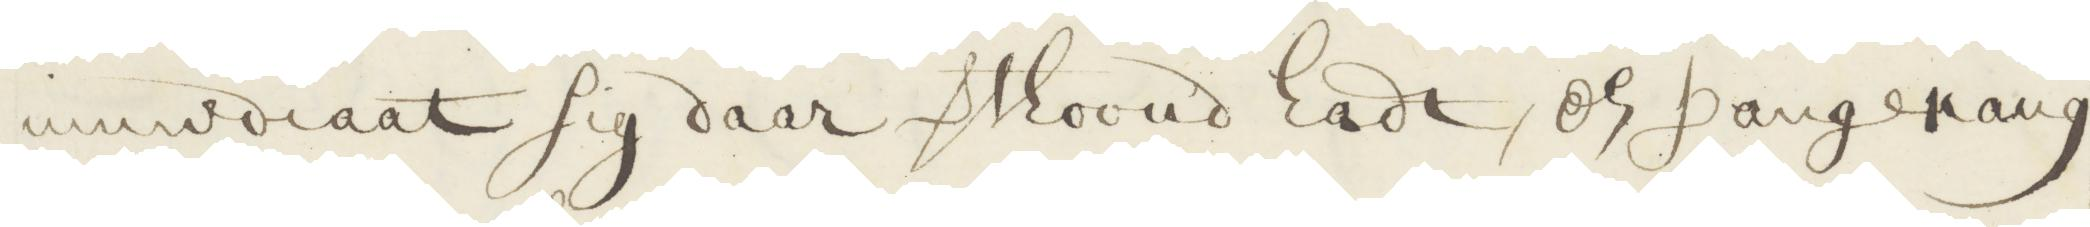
immediaat sig daar verthoond hadt, den pangerang
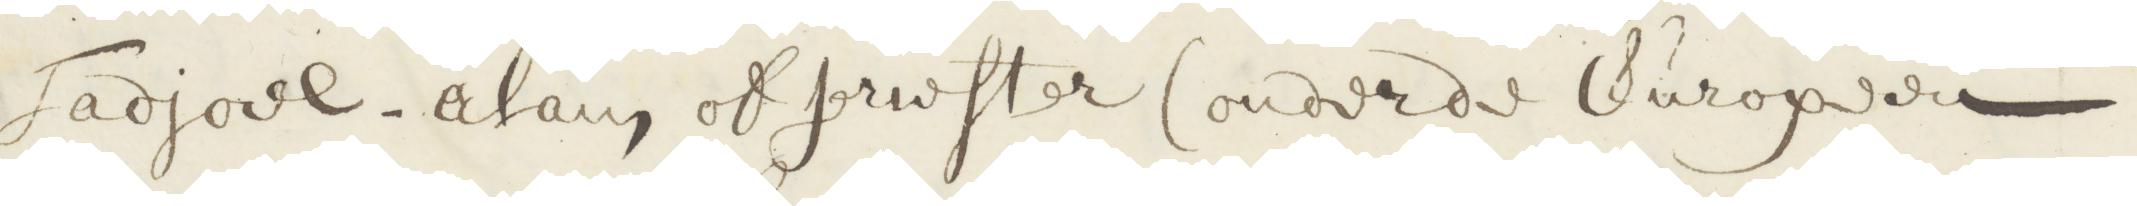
Tadjoel-alam of priester (onder de Europeen
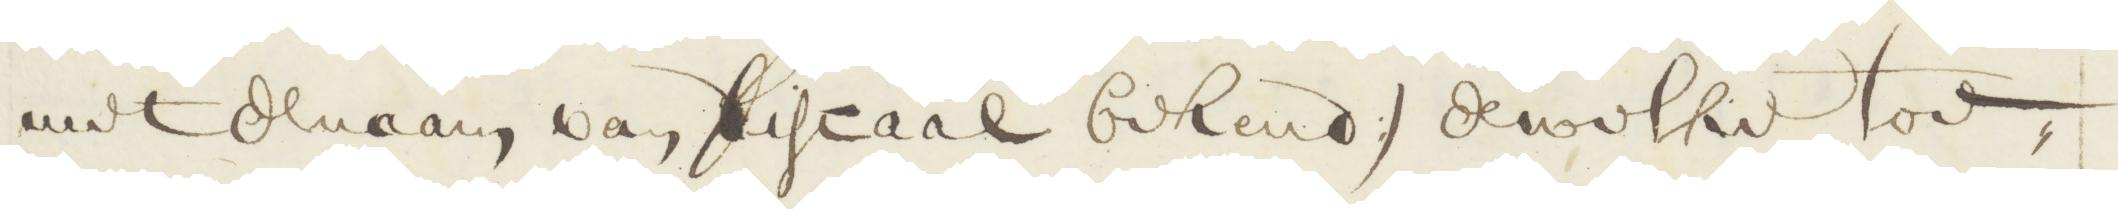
met de naam van fiscaal bekend:) dewelke toe„
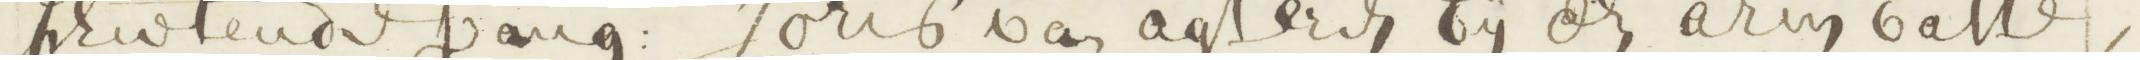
schietende pang:e Joris van agteren bij den arm vatte,
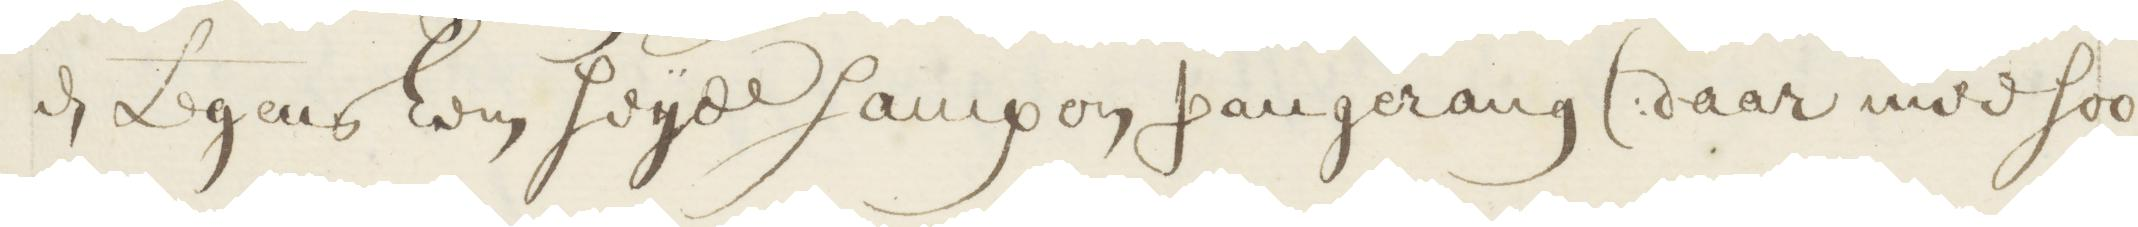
en tegens hem seijde sampon pangerang (:daar mee soo
